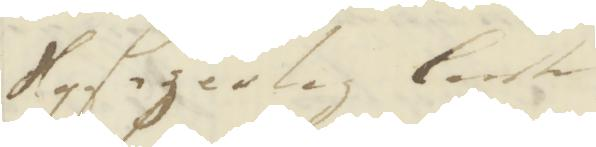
Vyfenzestig Cent
